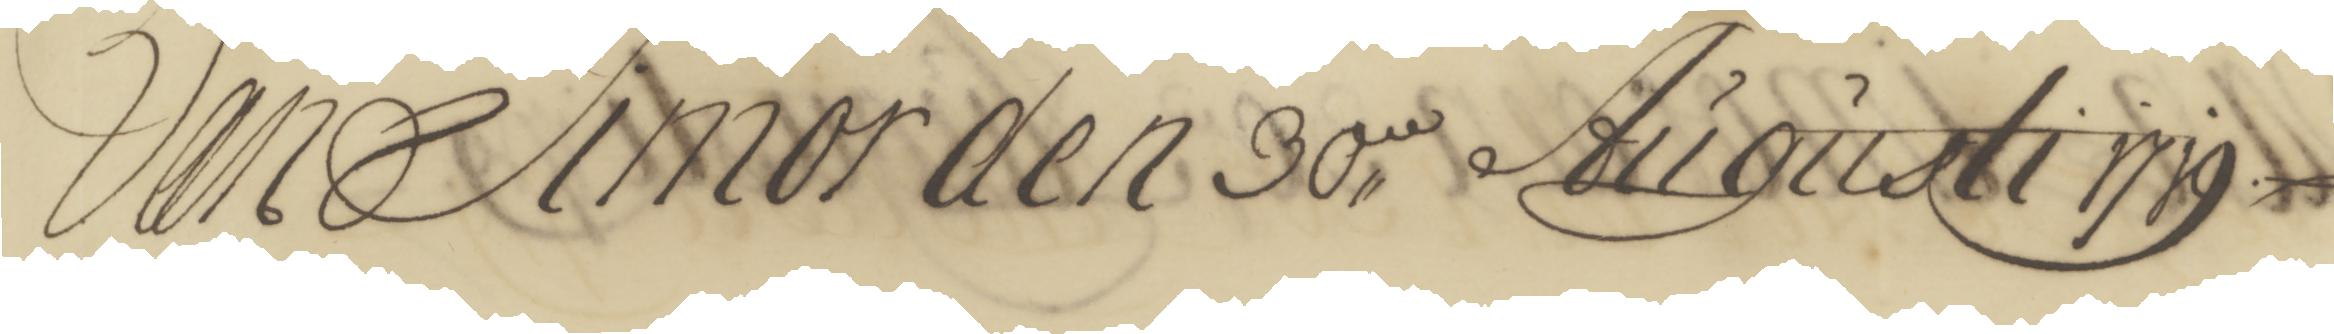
Van Timor den 30„ Augusti 1719.-
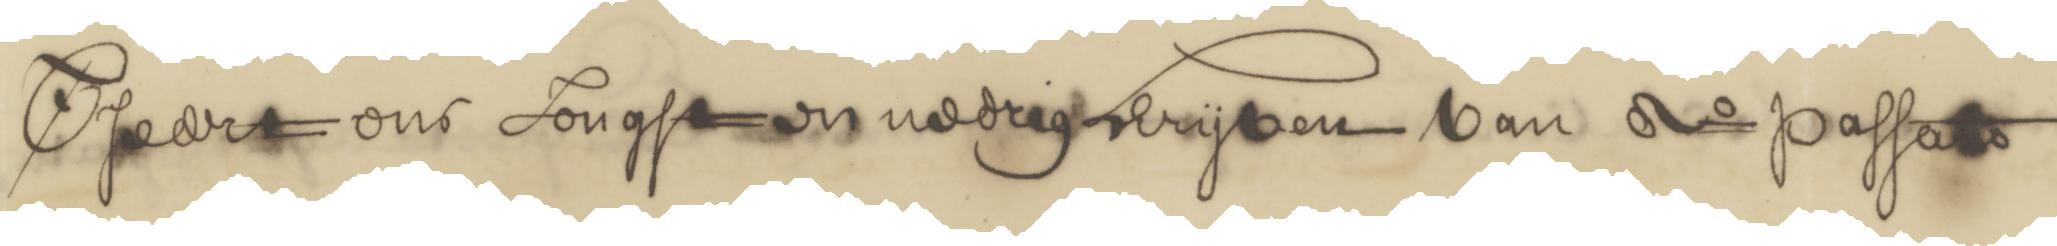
Tsedert ons Iongst en nedrig schrijven van d=o passato
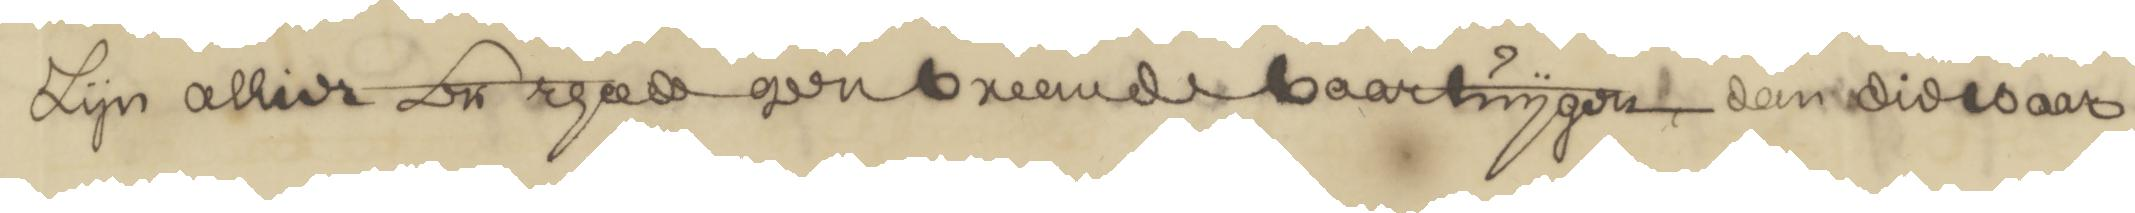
zijn alhier ter rheede geen vreemde vaartuijgen dan diewaar
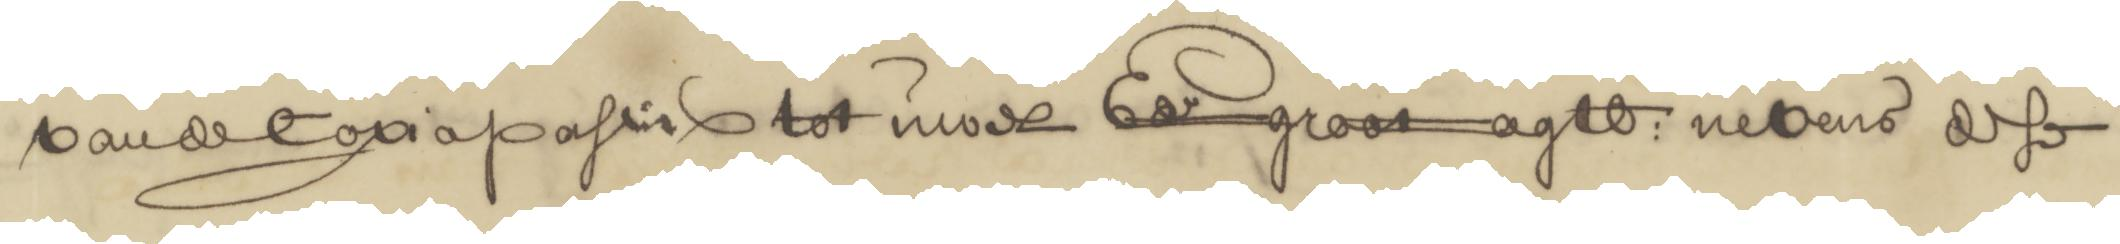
van de Copia passes tot uwel Ed= groot agtb: nevens dese
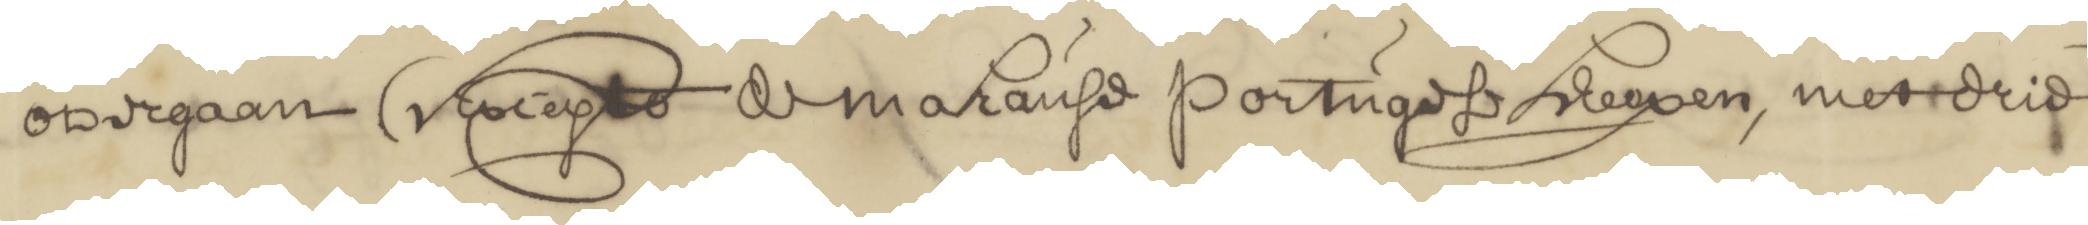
overgaan (Excepto de makause portugese scheepen, met drie
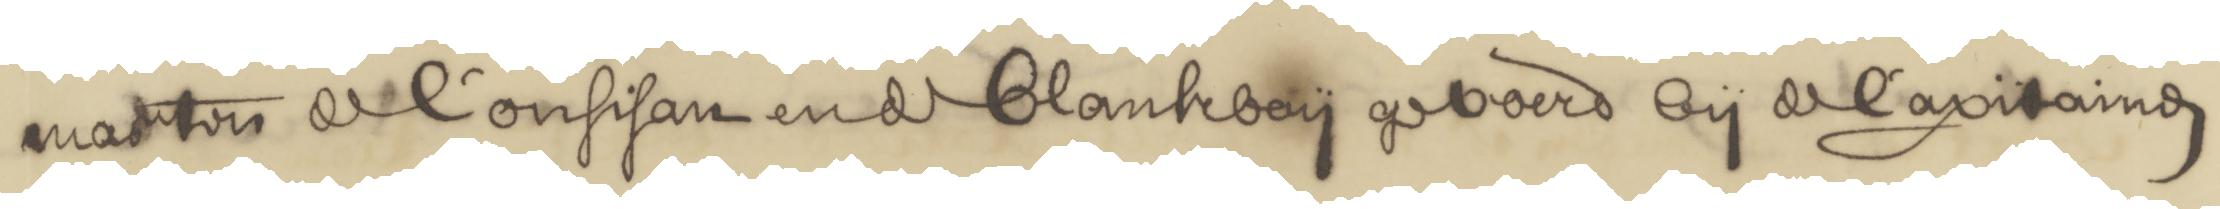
masten deConsisan endeblankbaij gevoerd bij deCapitainen
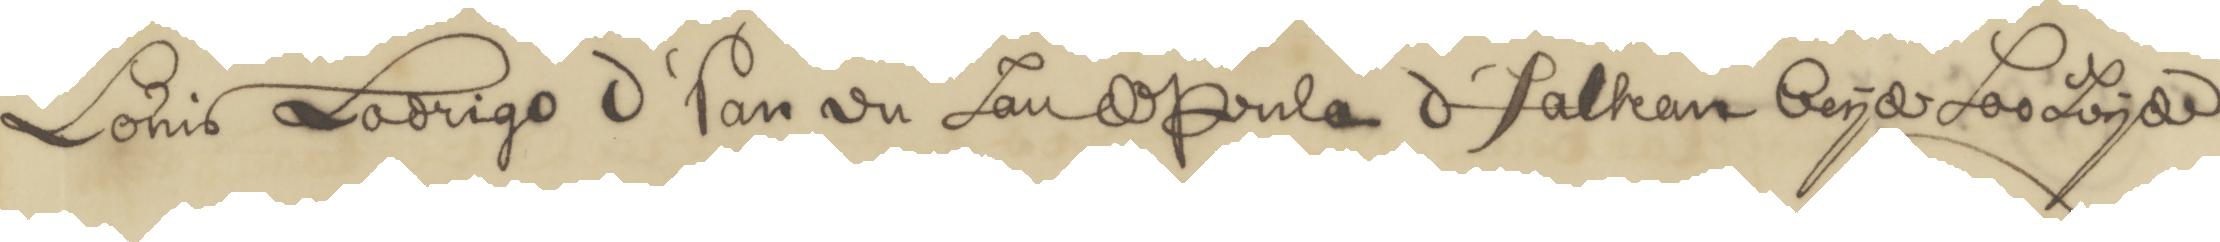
Louis Lodrigo d’Van en Iandepenha d’falkan beijde soo zeijde
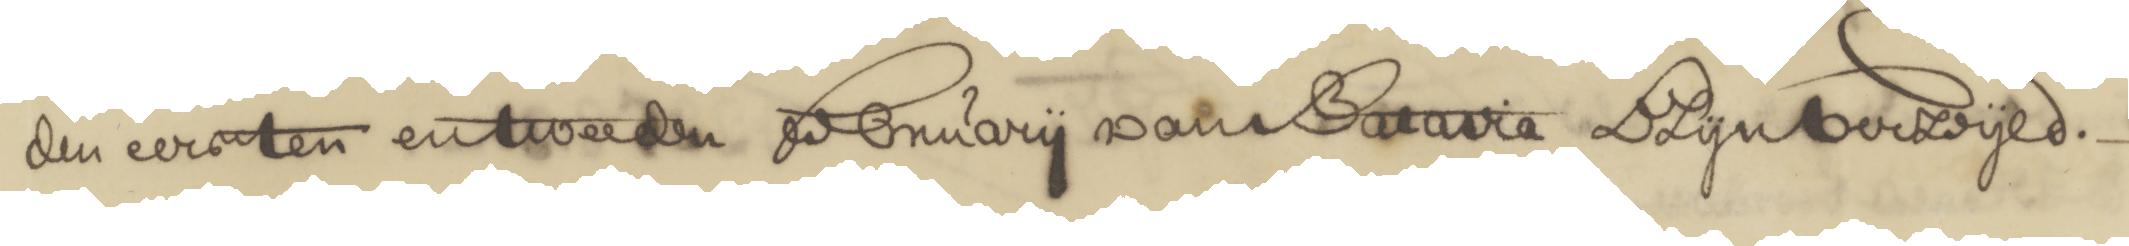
den eersten entweeden februarij vanBatavia tezijnverzeijld.
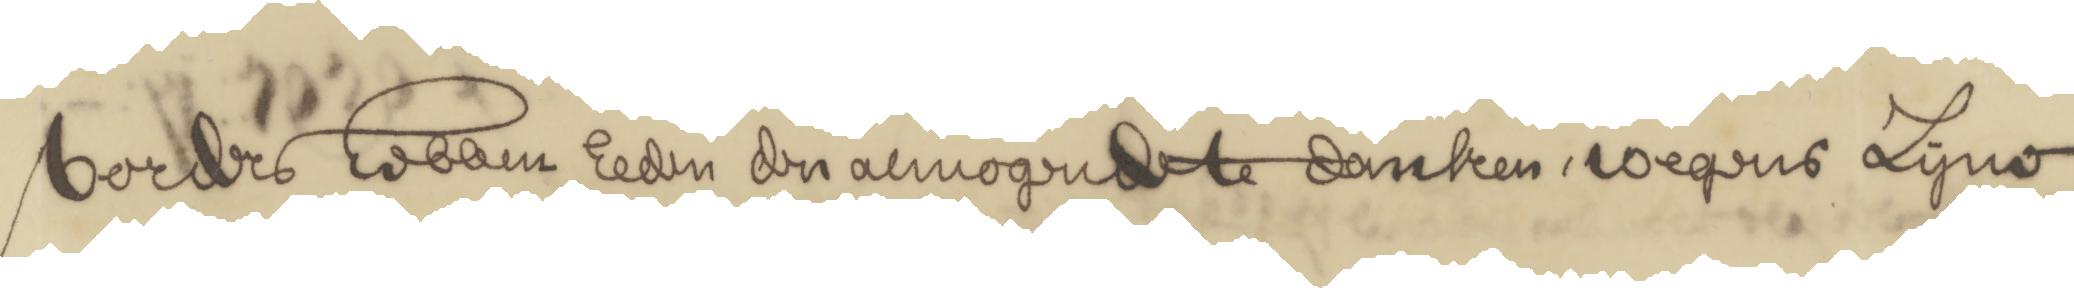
verders hebben heden den almogendete danken, wegens zijne
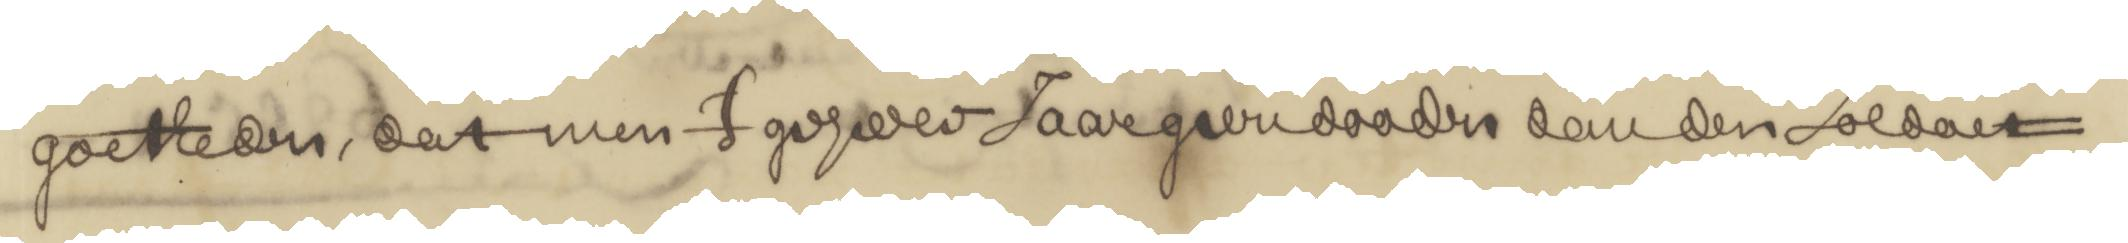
goetheden, dat men ’t geheele Jaargeen dooden dan den soldaet
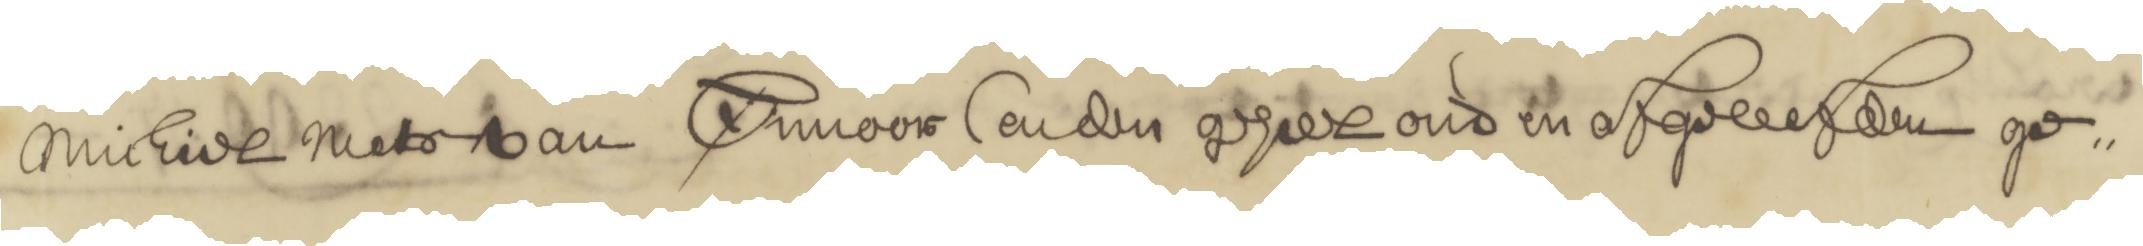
michiel mets van Timoor (enden geheel oud en afgeleefden ge„
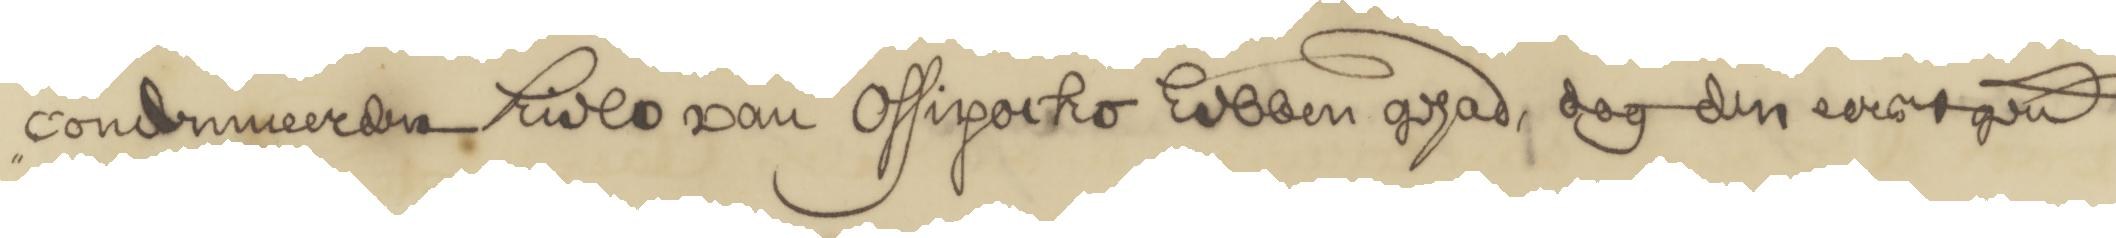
condenmeerden kielo van Ossipocko hebben gehad, dog den eerstgen
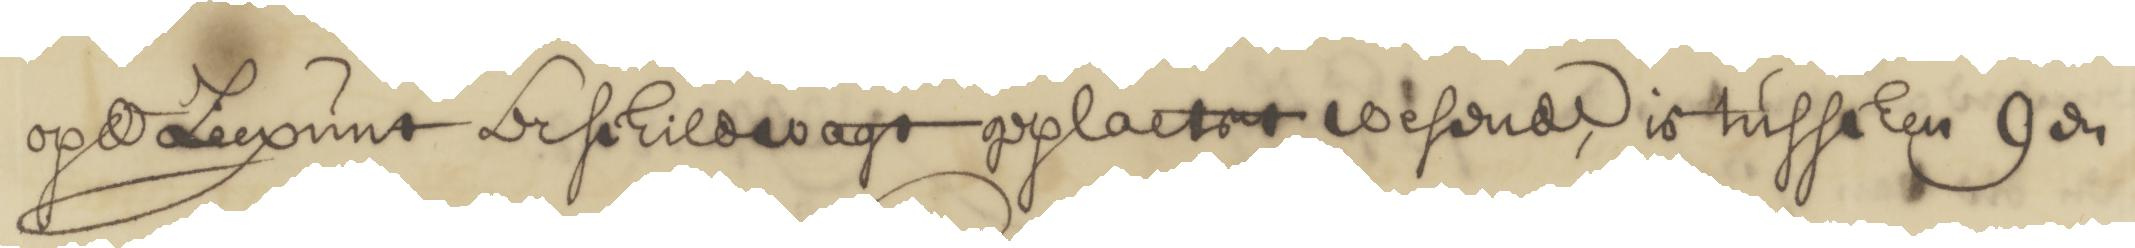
opde Zeepunt terschildwagt geplaetst wesende, is tusschen 9 en
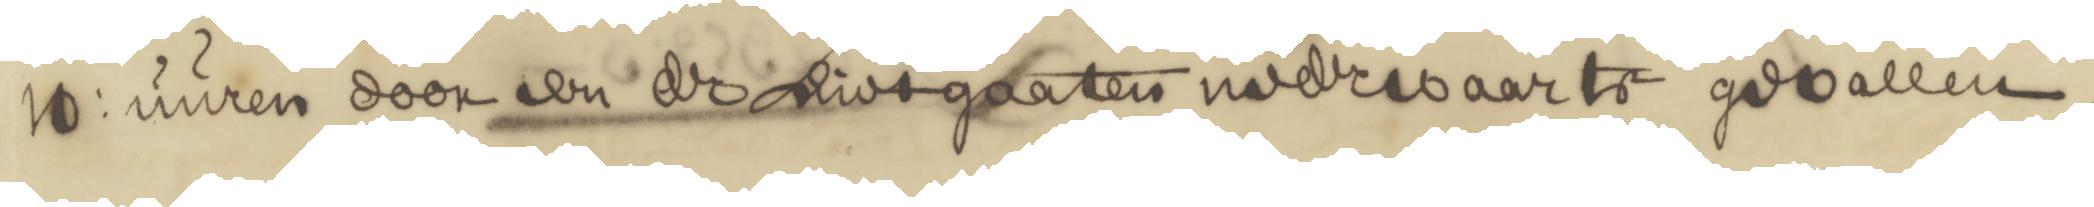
10: uuren door een der schietgaaten nederwaarts gevallen
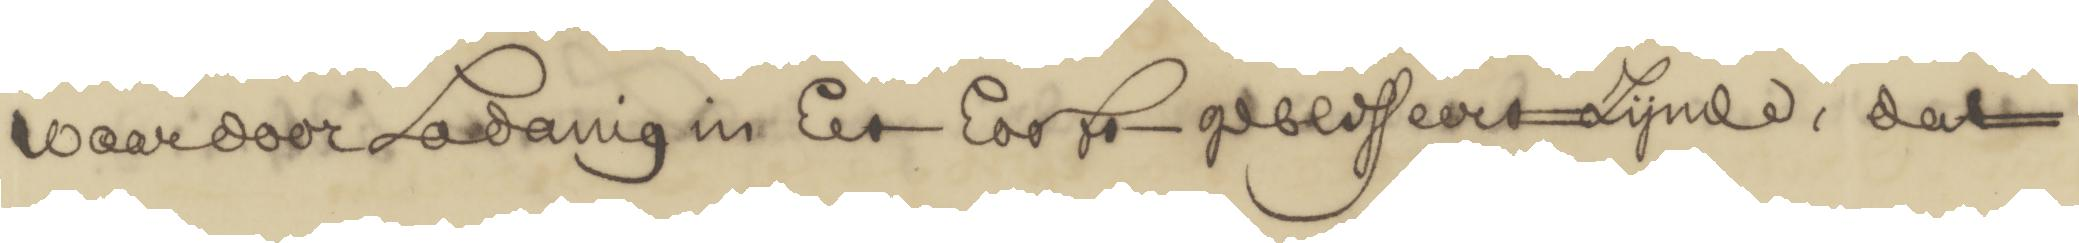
waardoor sodanig in het hooft geblesseert zijnde, dat
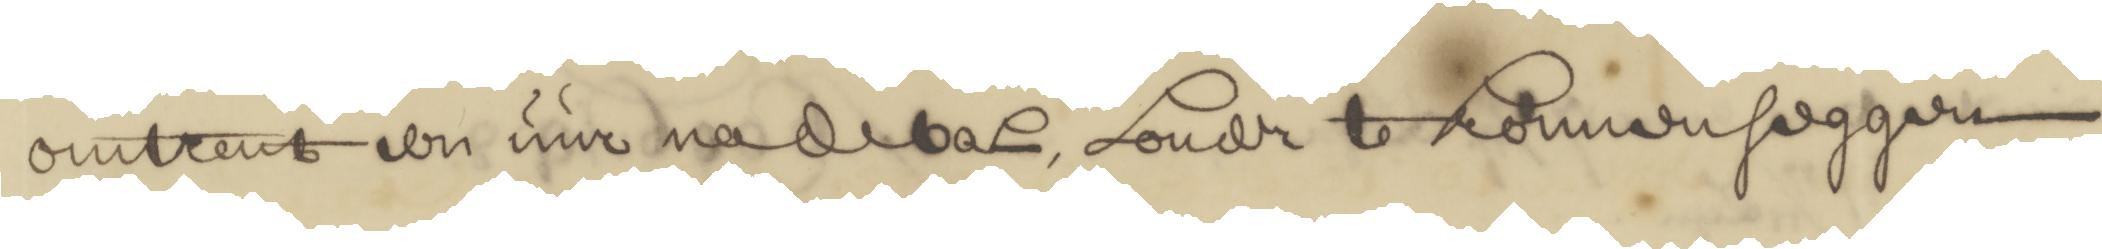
omtrent een uur nadeval, sonder te konnenseggen
